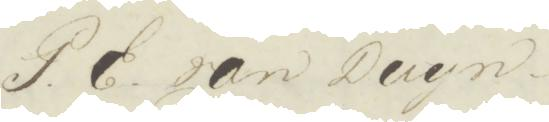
P: E. van Duyn
